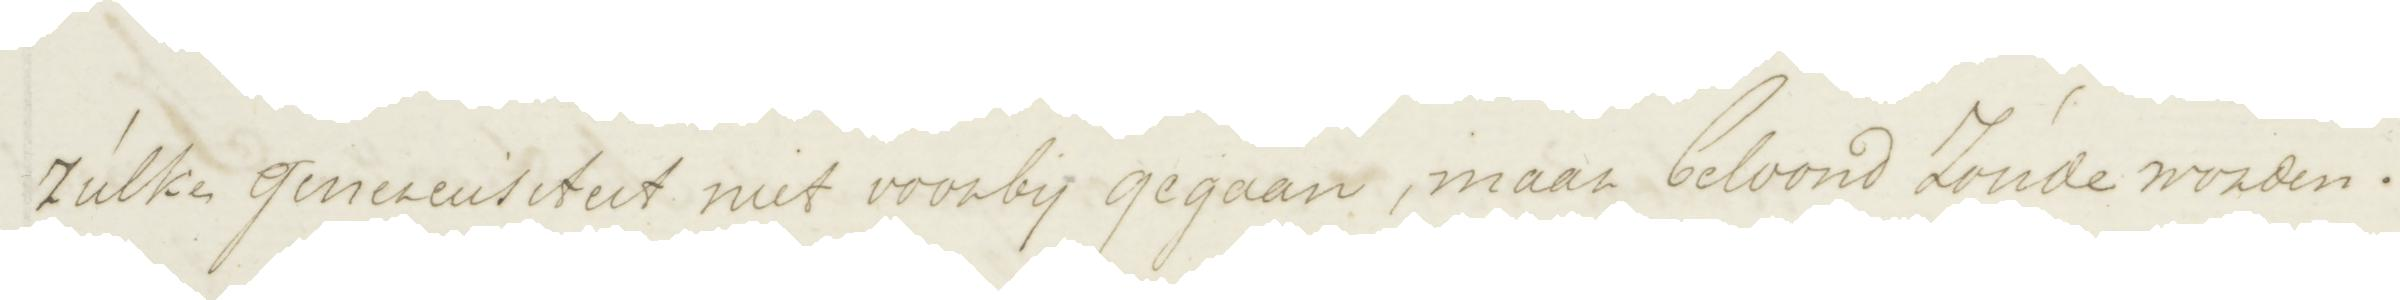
zulke genereusiteit niet voorbij gegaan, maar beloond Zoude worden
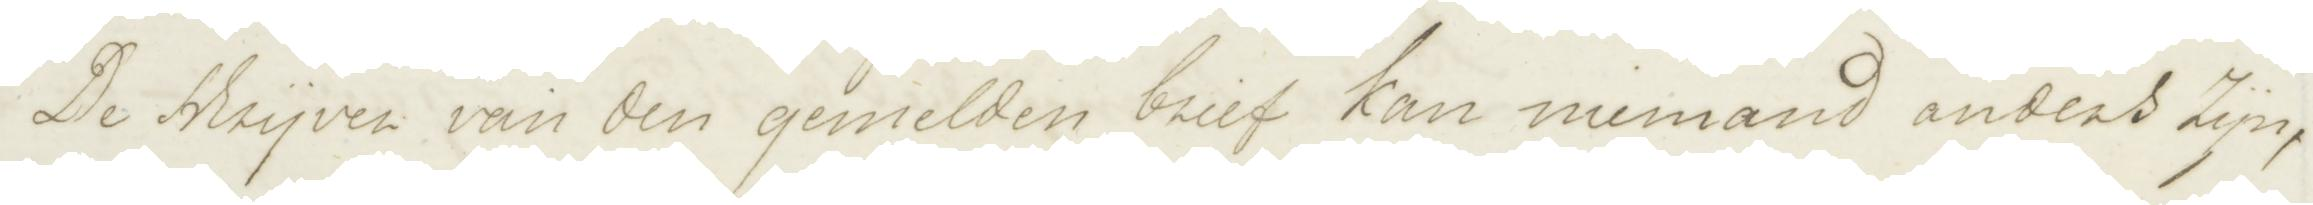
De schrijver van den gemelden brief kan niemand anders Zijn,
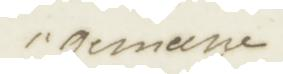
„gemeene
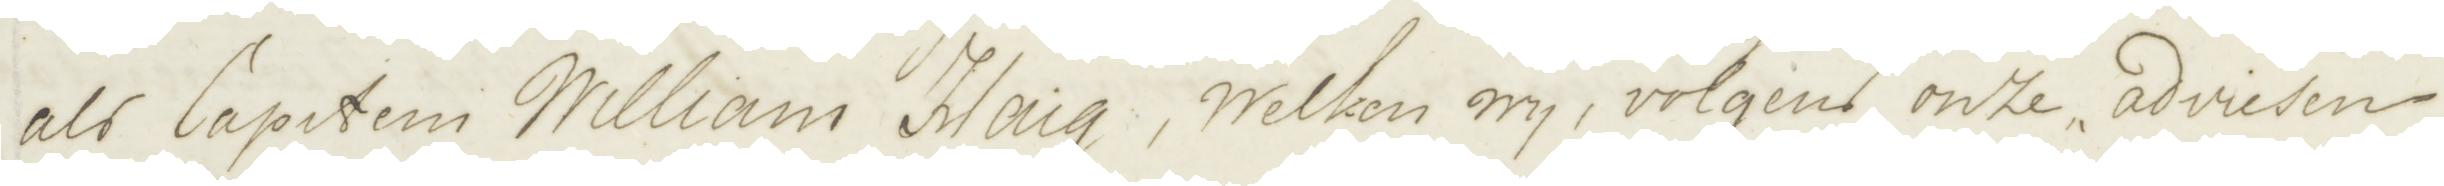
als Capitein William Haig, welken wij, volgens onze „ adviesen
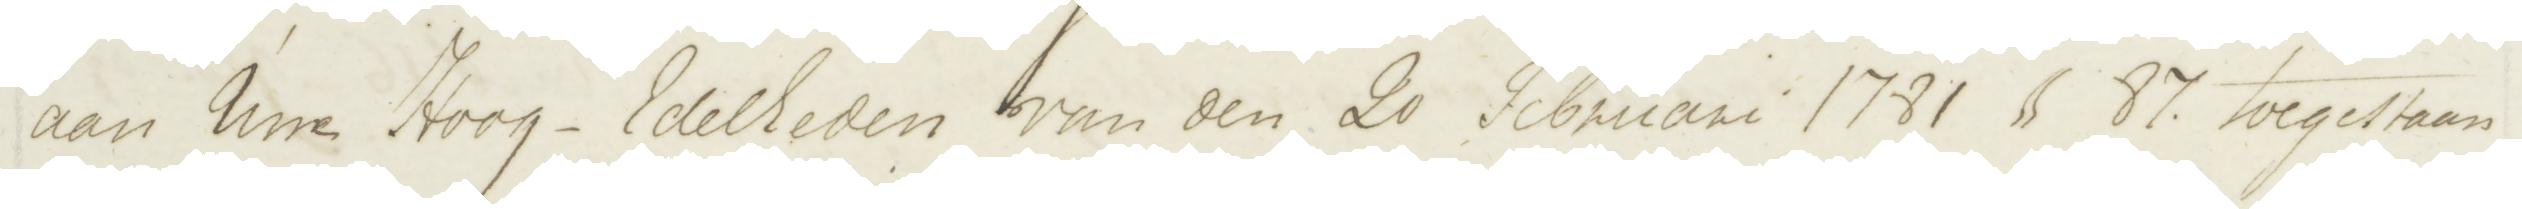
aan uw Hoog-Edelheden van den 20 Februari 1781 SS 87. toegestaan
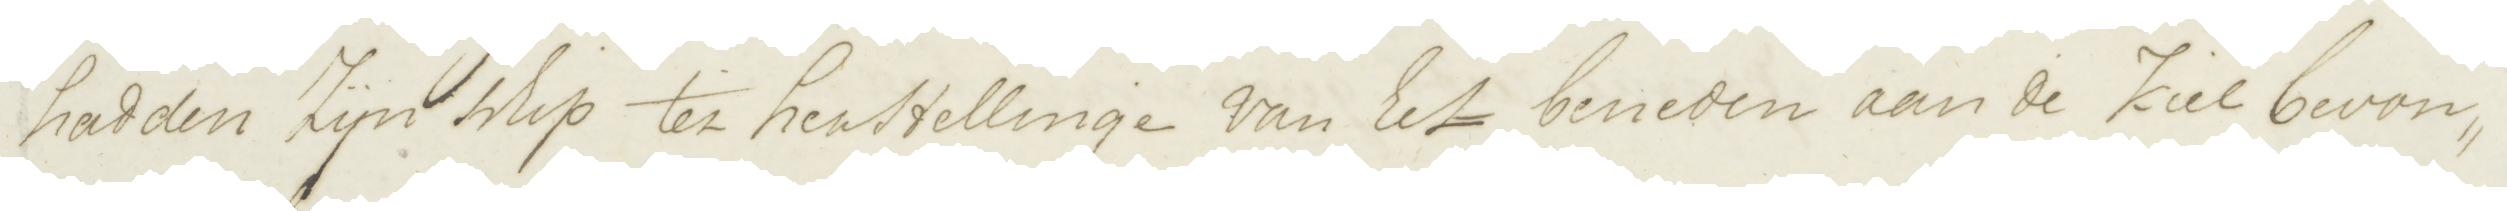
hadden Zijn schip ter herstellinge van het beneden aan de kiel bevon„
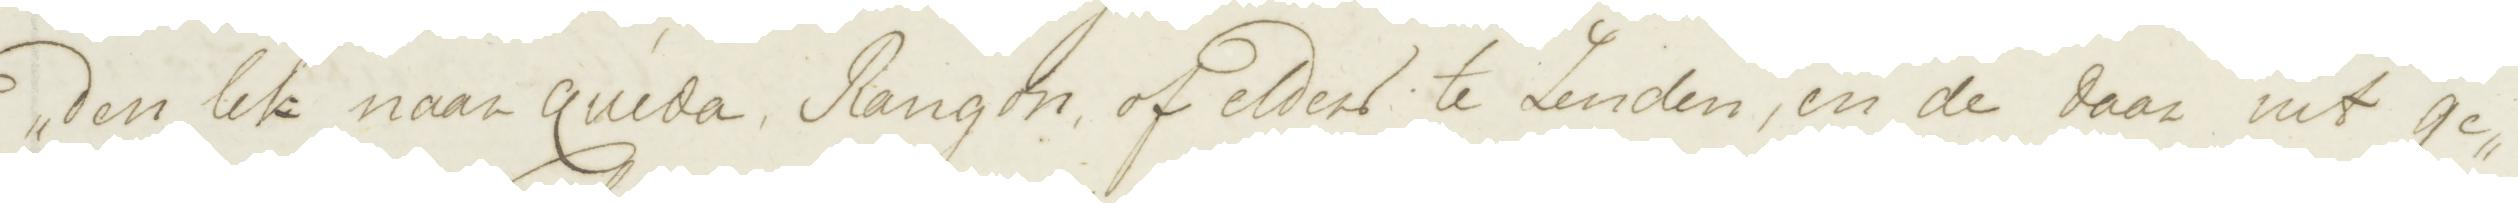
den lek naar queda, Rangon, of elders te Zenden, en de daar uit ge„
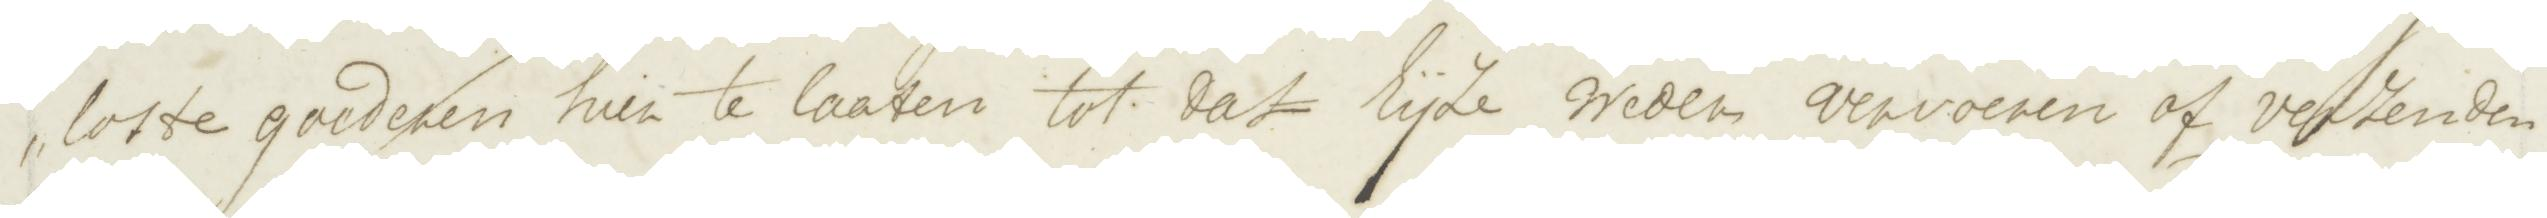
„loste goederen hier te laaten tot dat hijZe weder vervoeren of verzenden
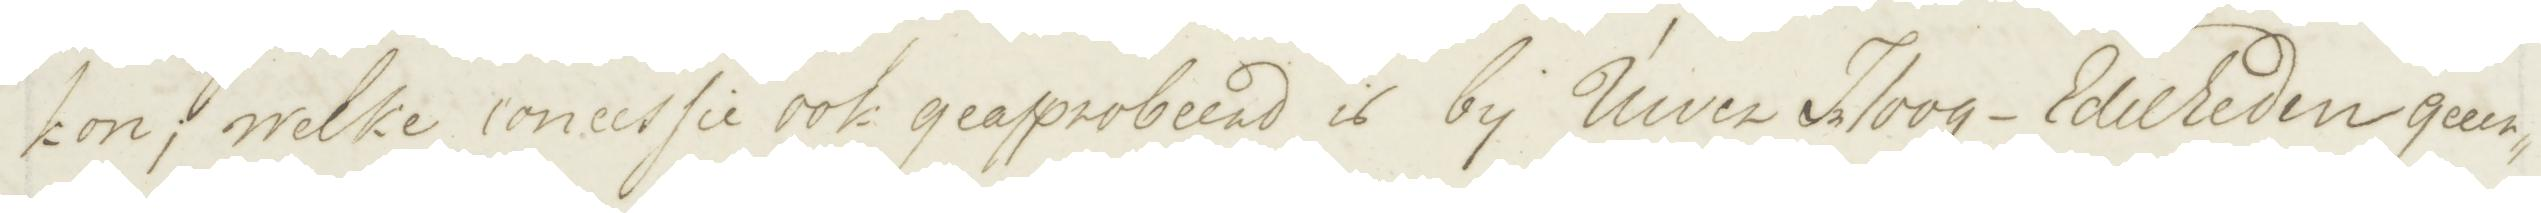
kon; welke concessie ook geapprobeerd is bij uwer Hoog-Edelheden geeer„
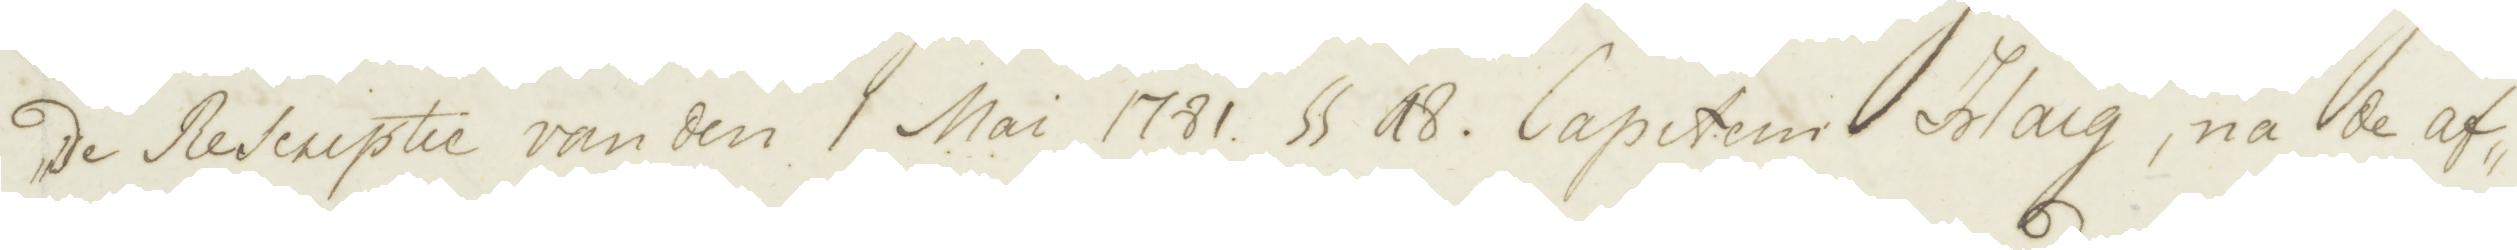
„de Rescriptie van den 1 Mai 1781 SS 48. Capitein Haig, na de af„
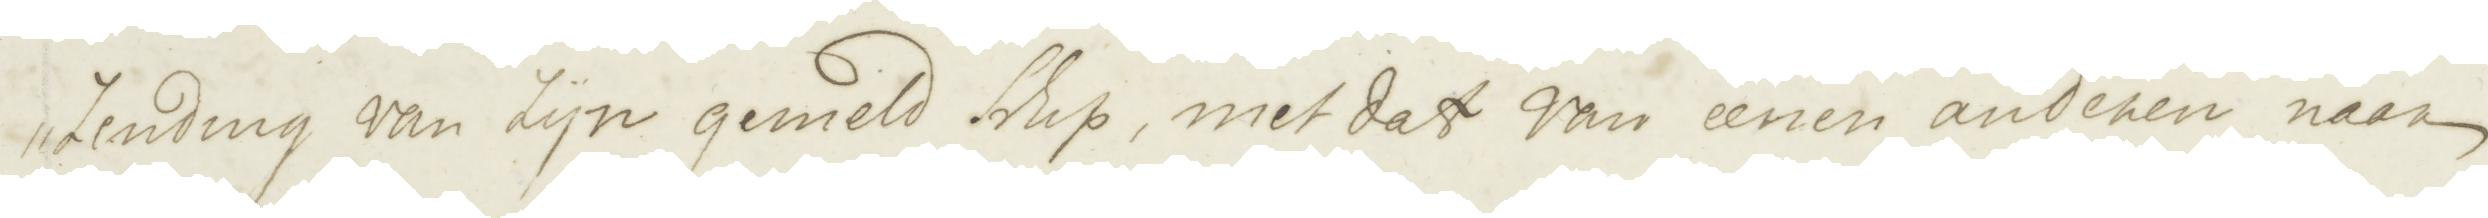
„Zending van zijn gemeld schip, met dat van eenen anderen naar
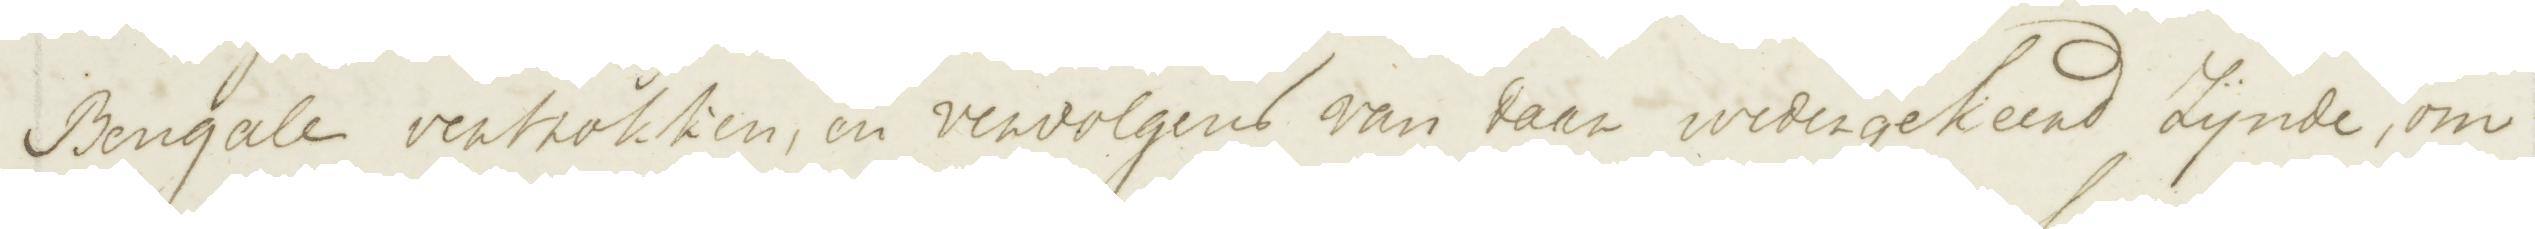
Bengale vertrokken, en vervolgens van daar wedergekeerd Zijnde, om
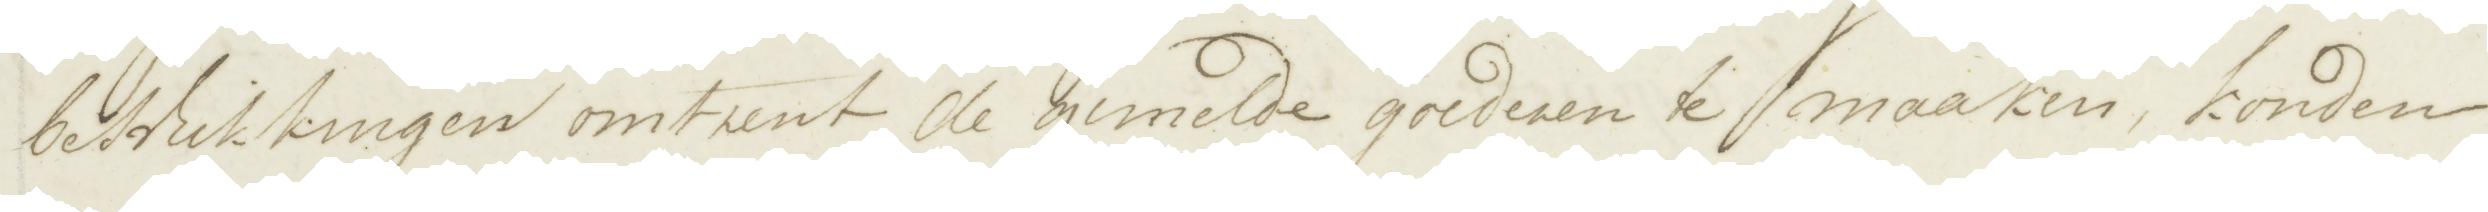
beschikkingen omtrent de gemelde goederen te maaken, konden
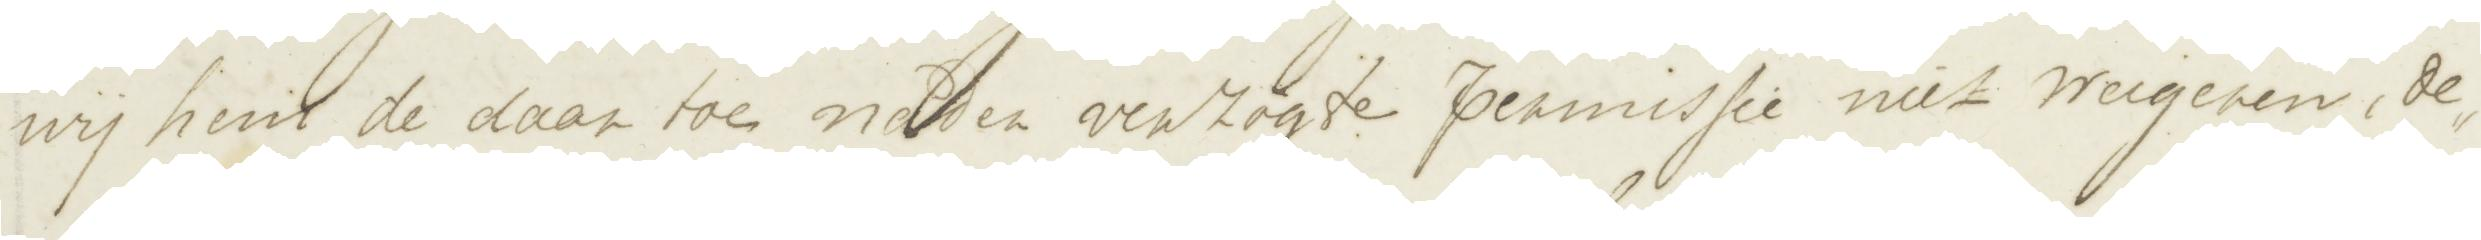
wij hem de daar toe nader verzogte permissie niet weigeren, de„
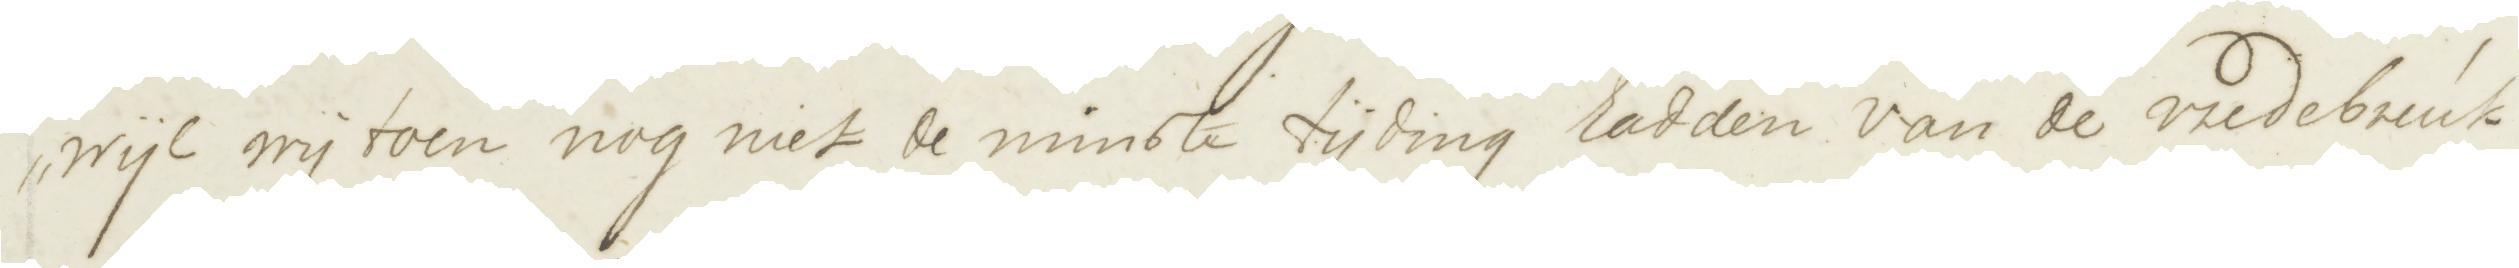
„wijl wij toen nog niet de minste tijding hadden van de vredebreuk
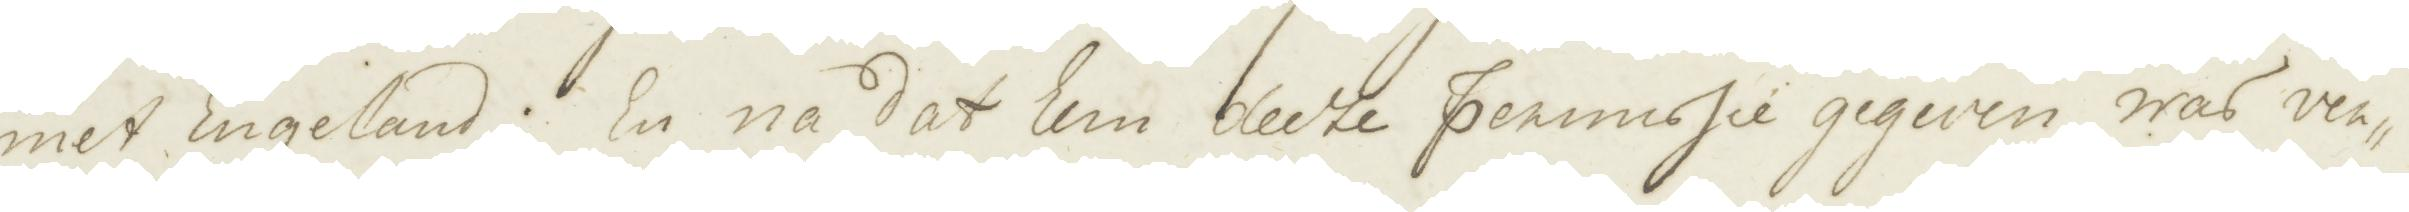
met Engeland; En na dat hem deeze permissie gegeven was ver„
